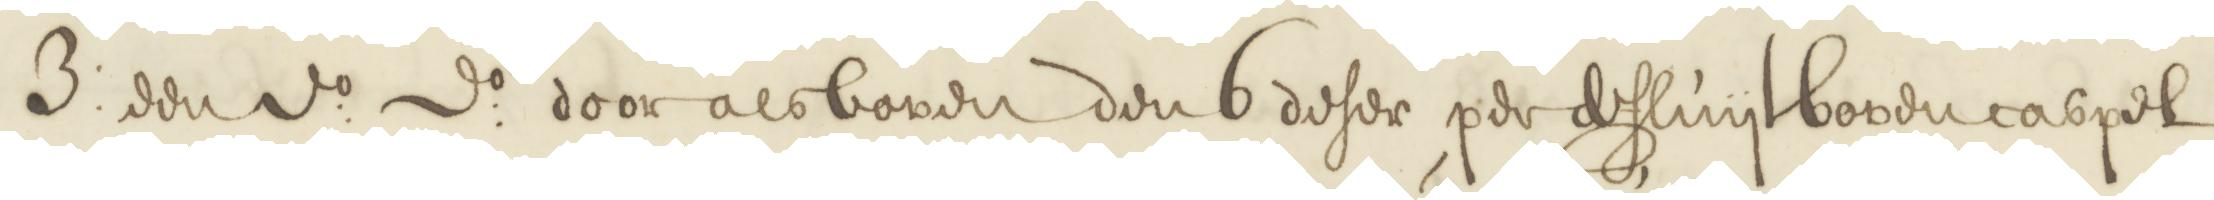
3: den d:o d:o door als boven den 6 deser per defluijtbovencaspel
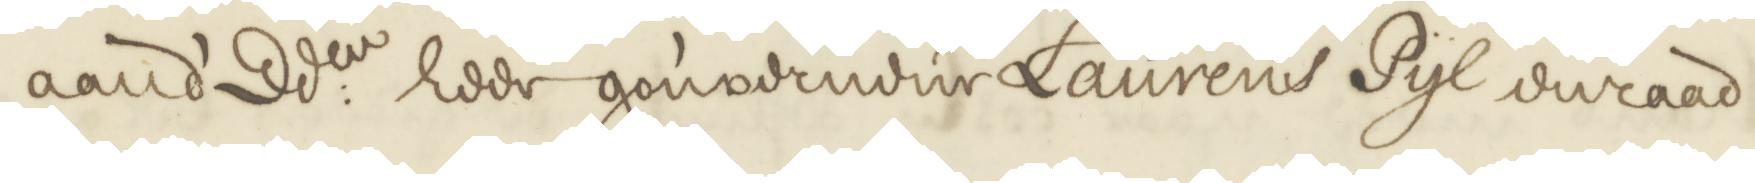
aand’ Ed:le heer gouverneur Laurens Pijl enraad
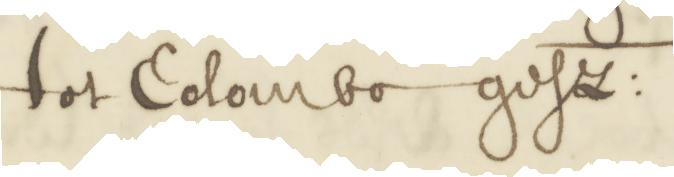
tot Colombo gesz:
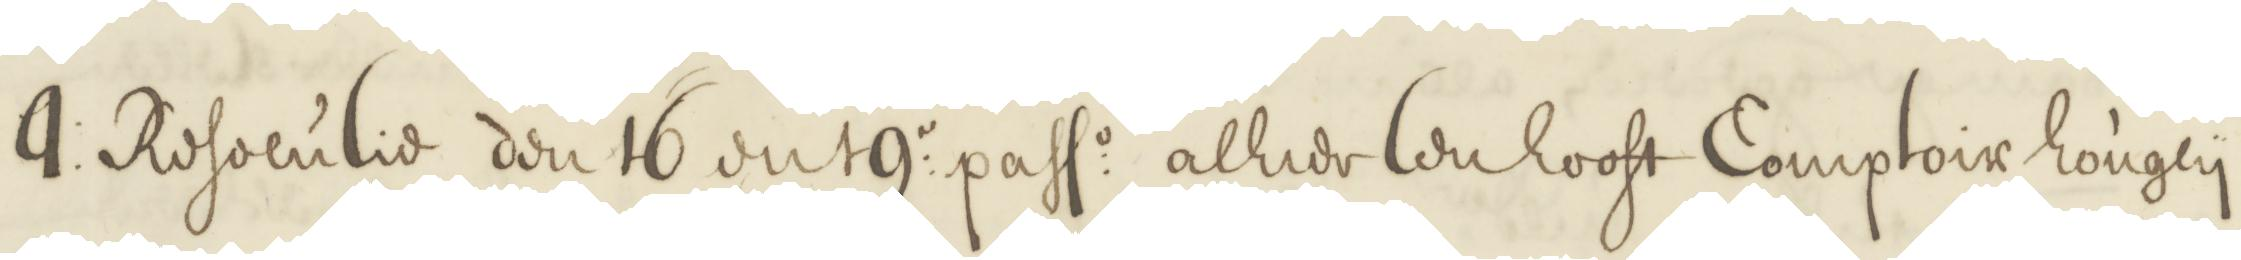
4: Resolutie den 16 en 19:' pass:o alhier ten hooft Comptoir houglij
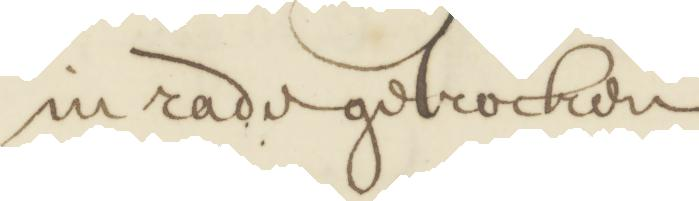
in rade getrocken
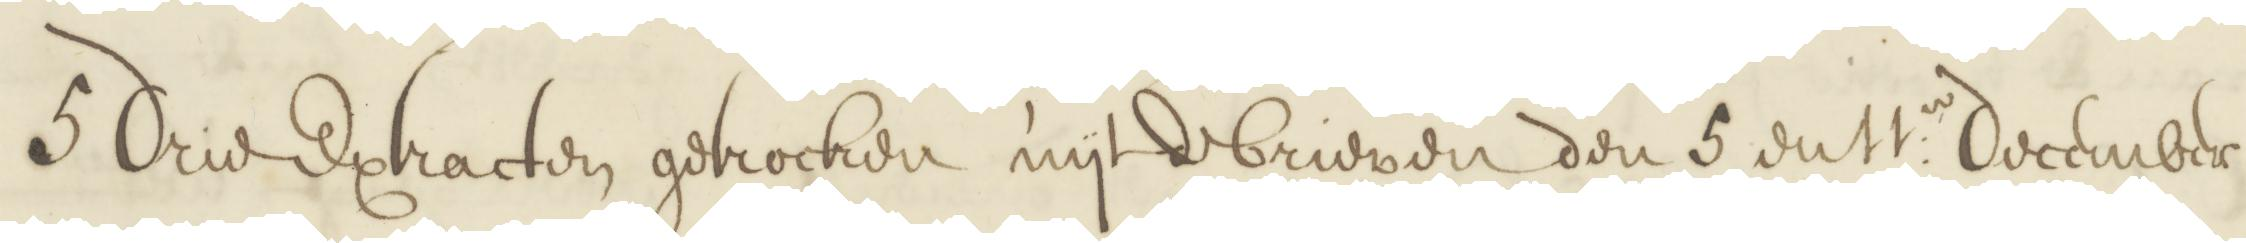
5 Drie Extracten getrocken uijt debrieven den 5 en 11:e December
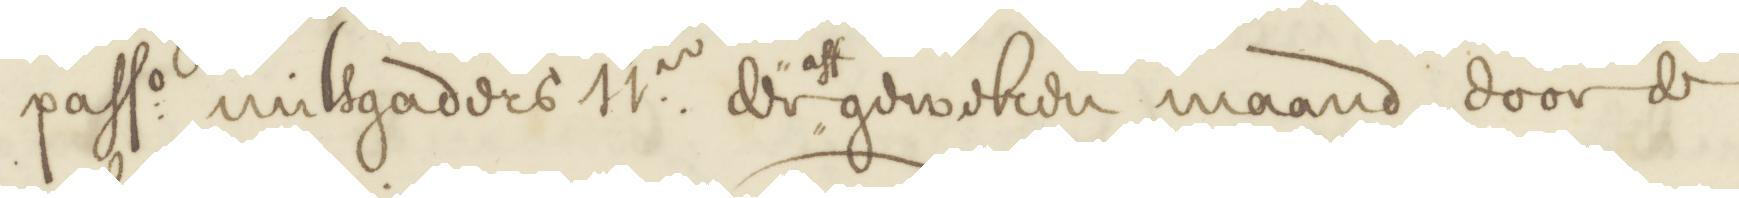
pass:o mitsgaders 11:e der „ geweken maand door de
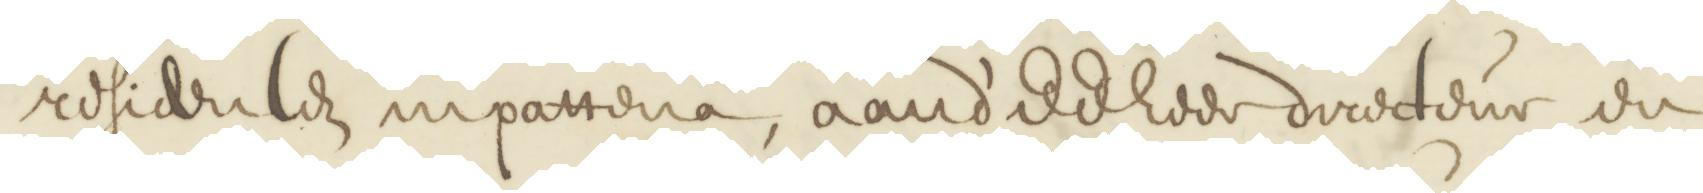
residenten in pattena, aand’ EEheer directeur en
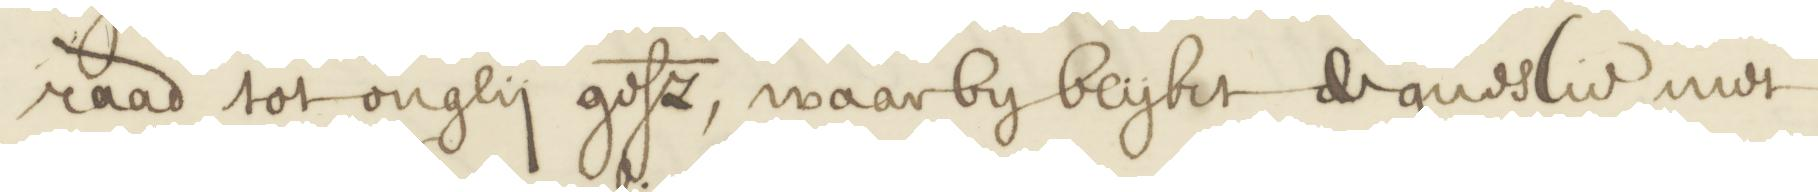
raad tot ouglij gesz, waarby blijkt de questie met
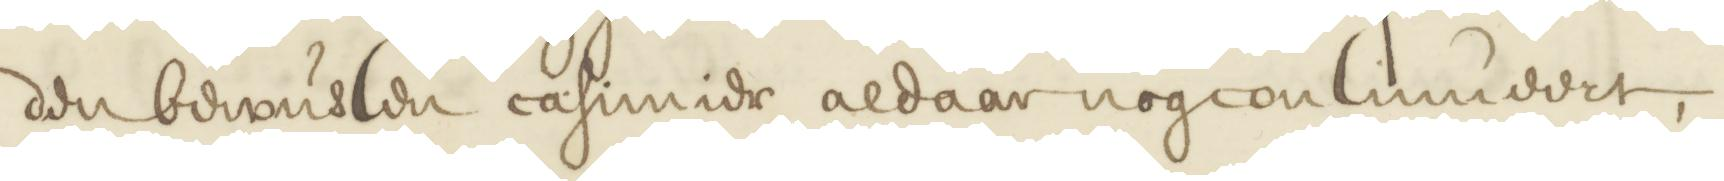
den bewusten casimier aldaar nog continueert,
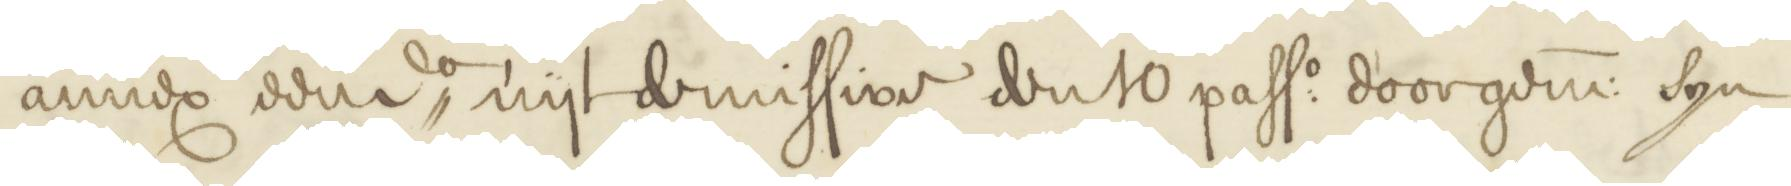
annex een D:o uijt demissive den 10 pass:o door gem: syn
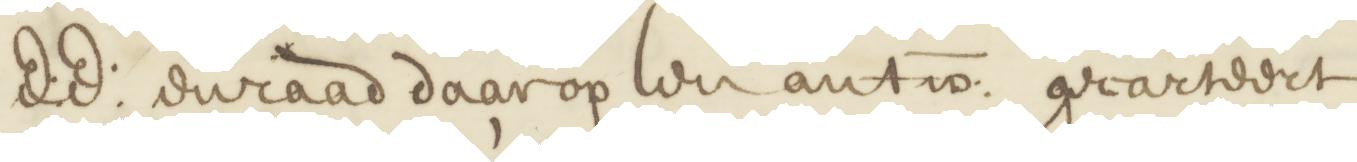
E:E: enraad daar op ten antw: gecarteert
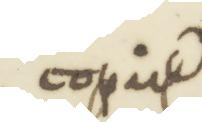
copie
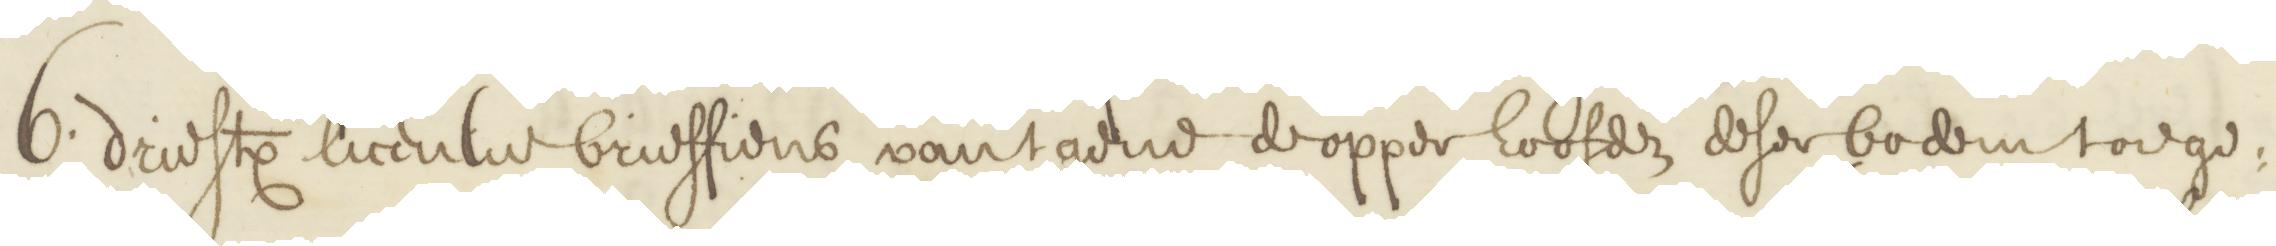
6. drieftx licentie brieffiens van’t gene de opper hoofden deser bodem toege„
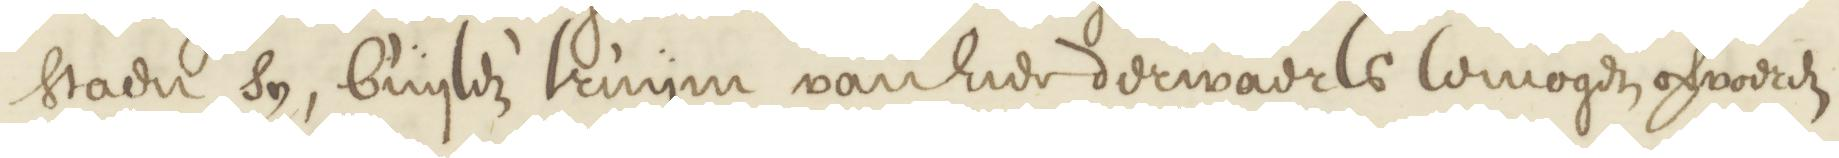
staen sy, buijten 'truijm van hier derwaerts temogen overvoeren
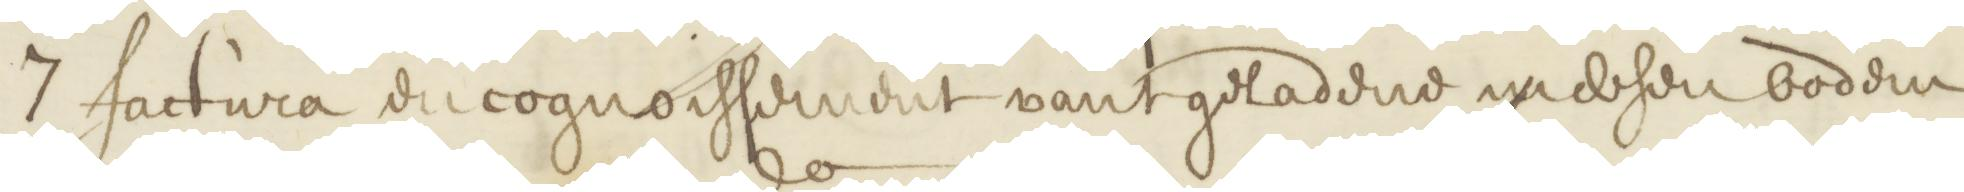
7 factura en cognoissement vant geladene in desen bodem
